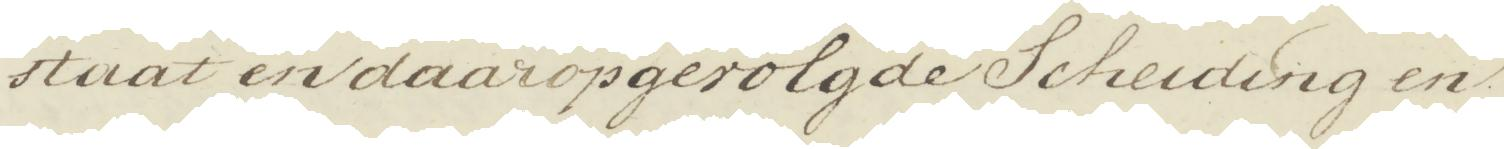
staat en daarop gevolgde scheiding en
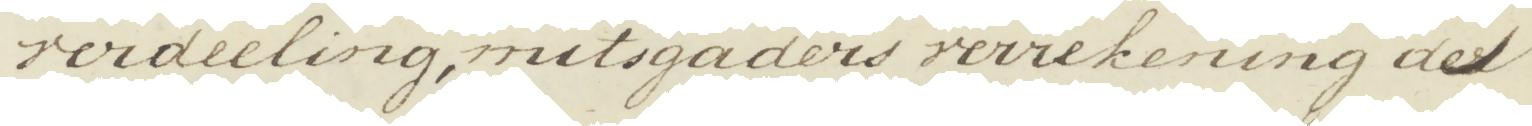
verdeeling, mitsgaders verrekening de
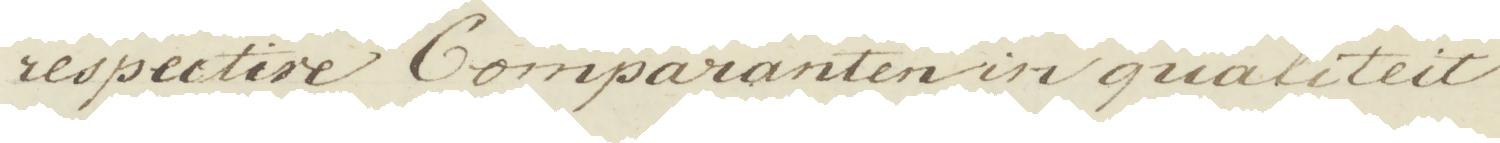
respective Comparanten in qualiteit
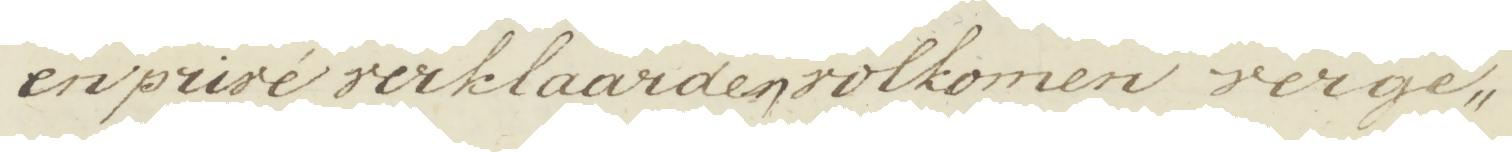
en privé verklaarden volkomen verge„
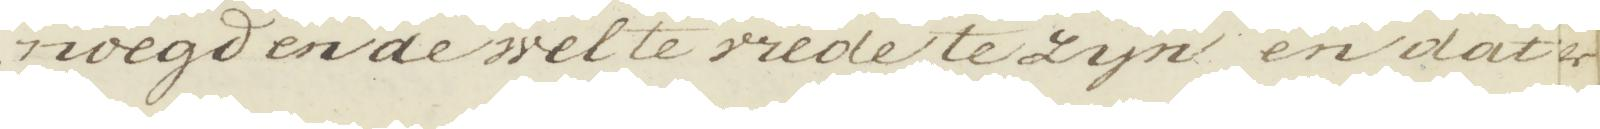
noegd en de wel te vrede te zyn en dat
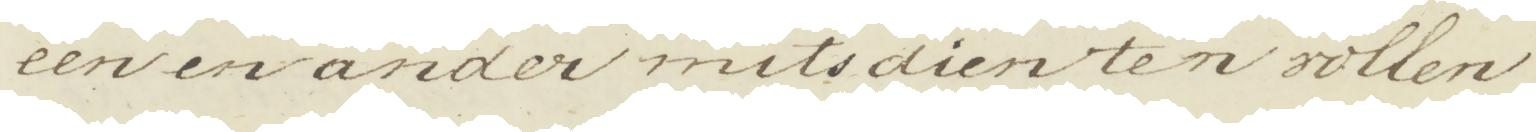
een en ander mitsdien ten vollen
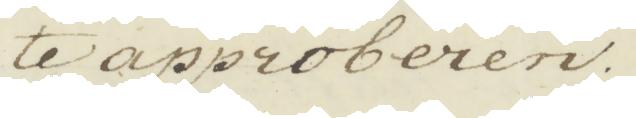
te approberen.
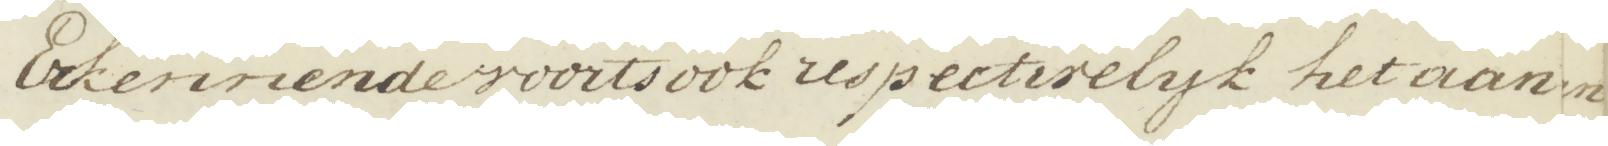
Erkennende voorts ook respectivelyk het aan
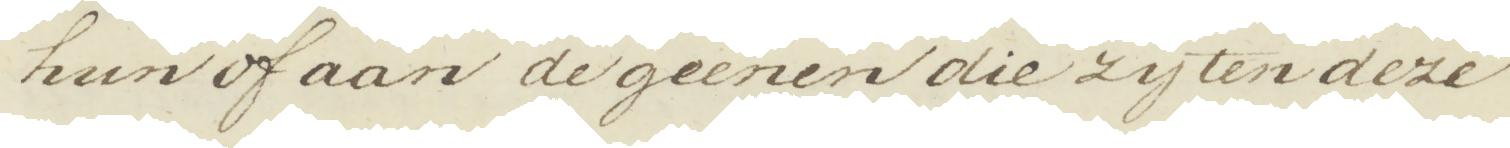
hun of aan de geenen die zy ten deze
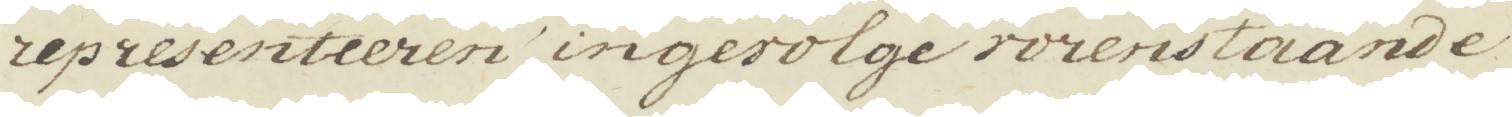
representeeren ingevolge vorenstaande
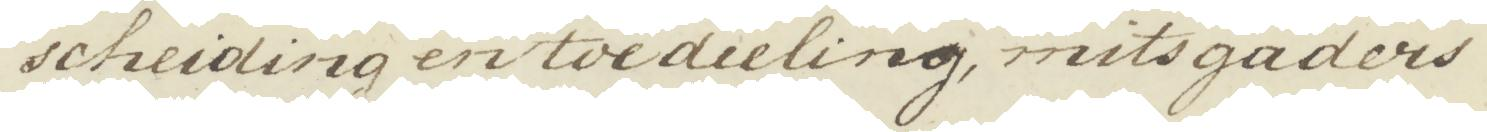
scheiding en toedeeling, mitsgaders
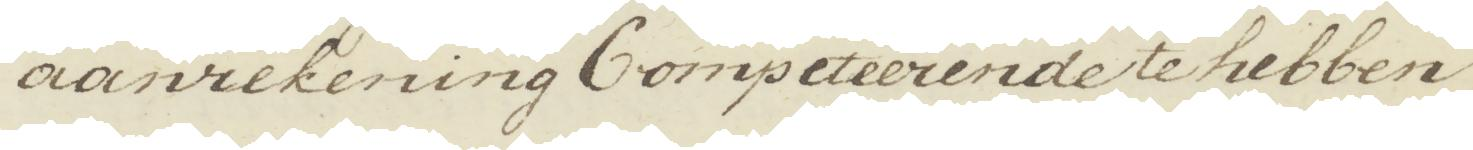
aanrekening Competeerende te hebben
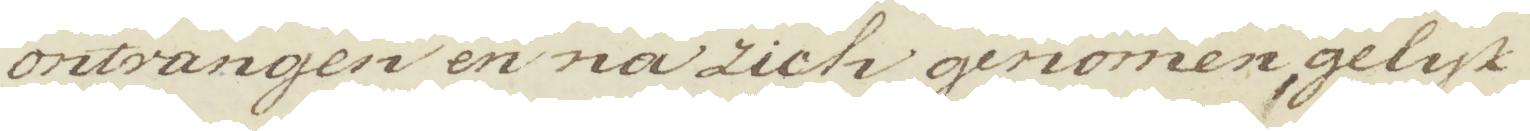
ontvangen en na zich genomen gelyk
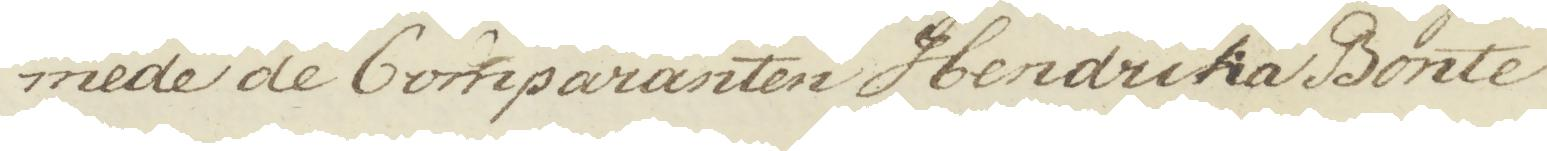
mede de Comparanten Hendrika Bonte
